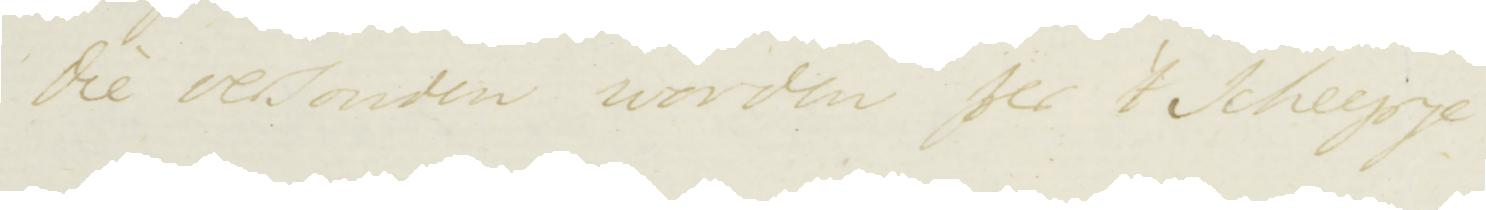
die versonden worden per 't scheepje
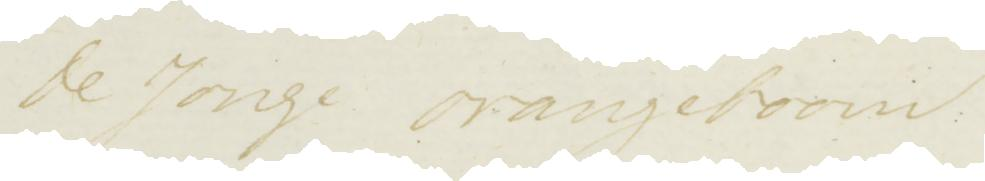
de Jonge orangeboom
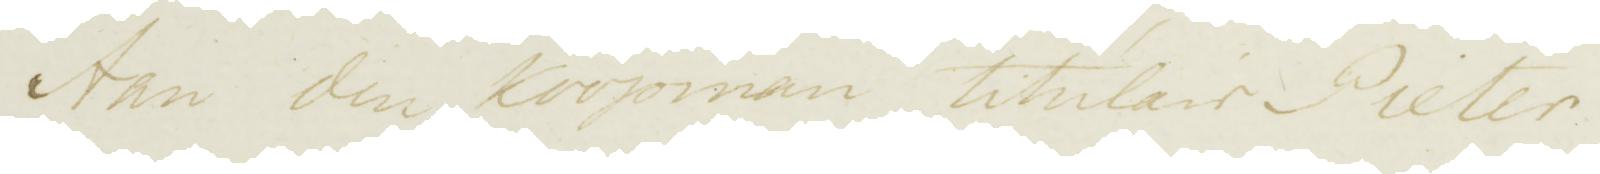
Aan den koopman titulair Pieter
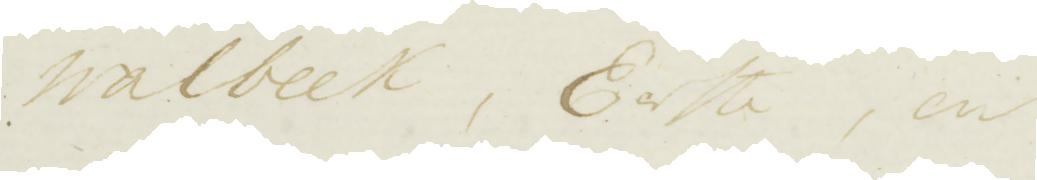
Walbeek , Eerste , en
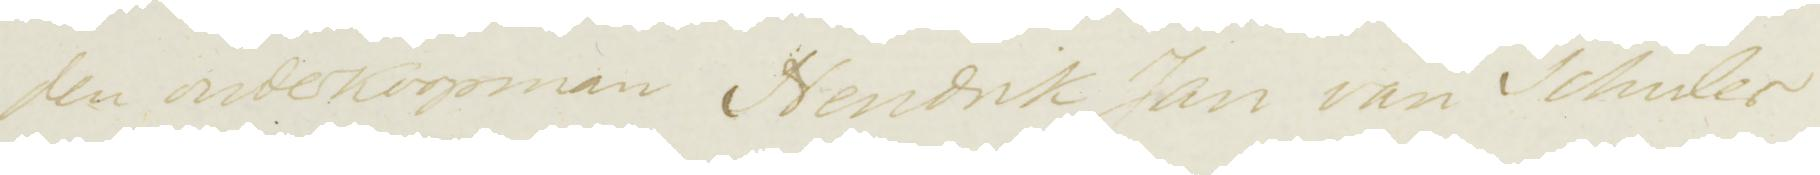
den onderkoopman Hendrik Jan van Schuler
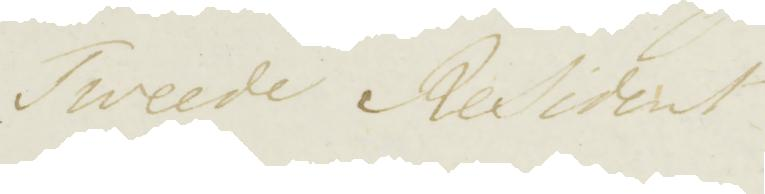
Tweede Resident
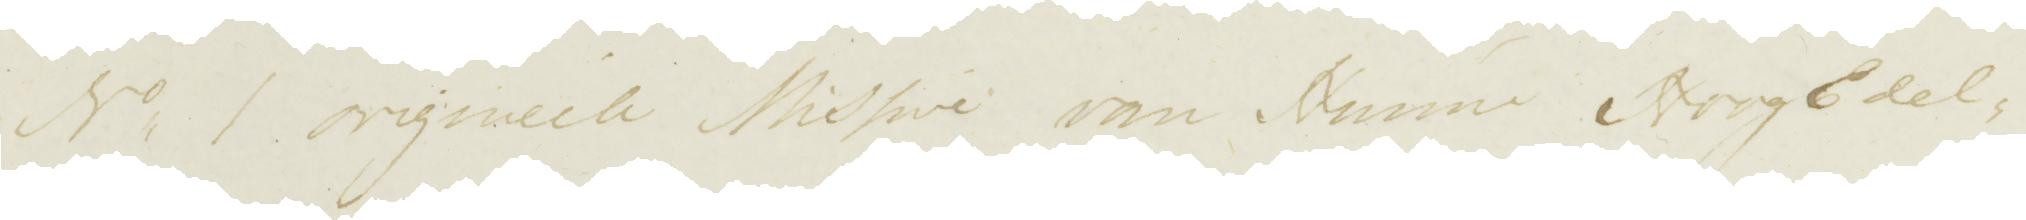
N„o 1 origineele Missive van Hunne Hoog Edel„
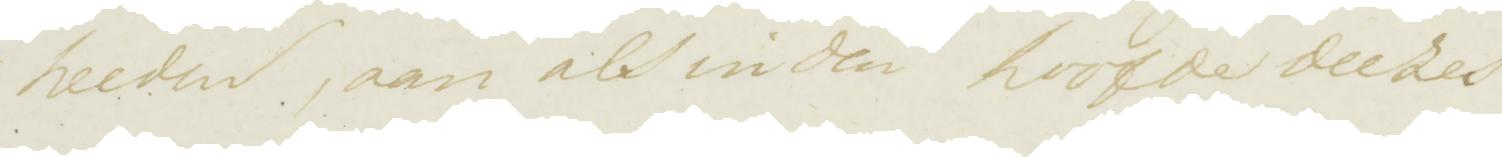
heeden , aan als in den hoofde deezes
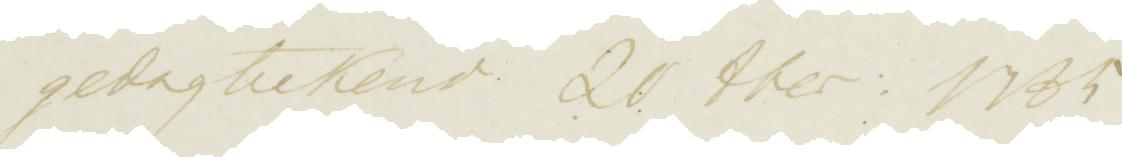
gedagtekend 20. 8ber: 1785
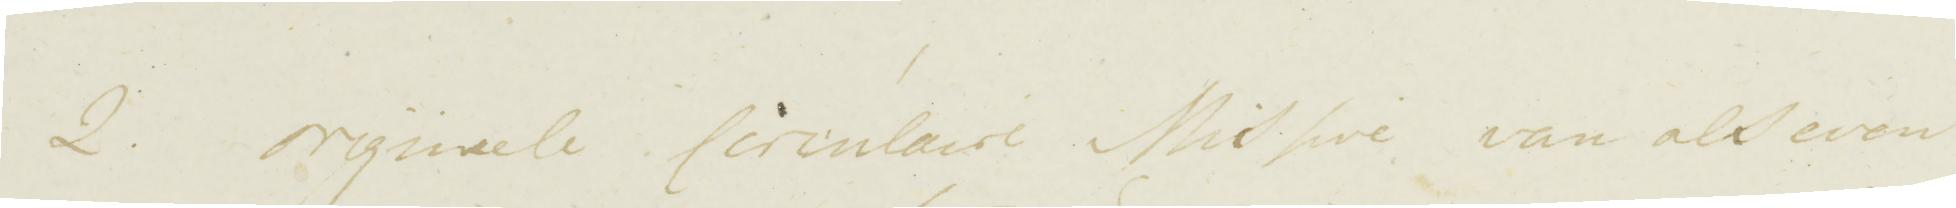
2. origineele circulaire Missive van als even
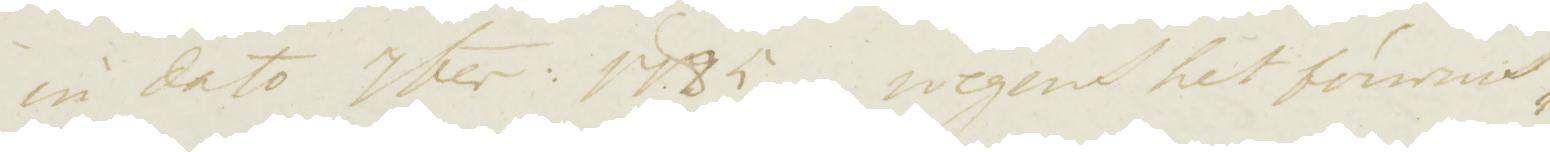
in dato 7ber: 1785 wegens het fournis„
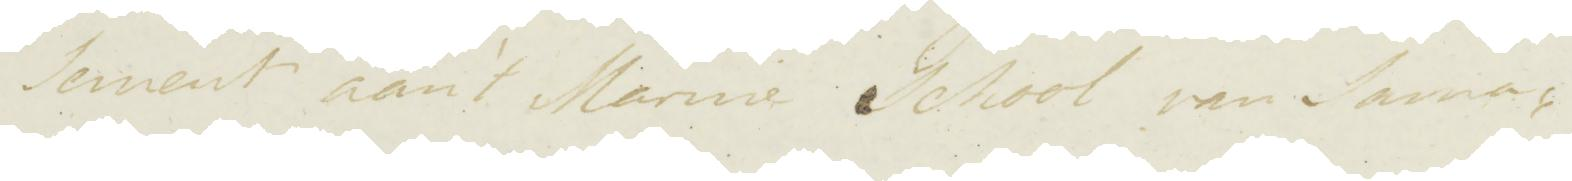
sement aan ’t Marine School van Sama„
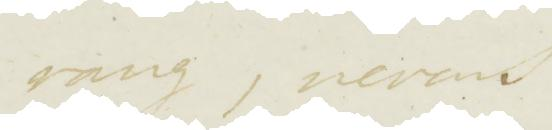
rang , nevens
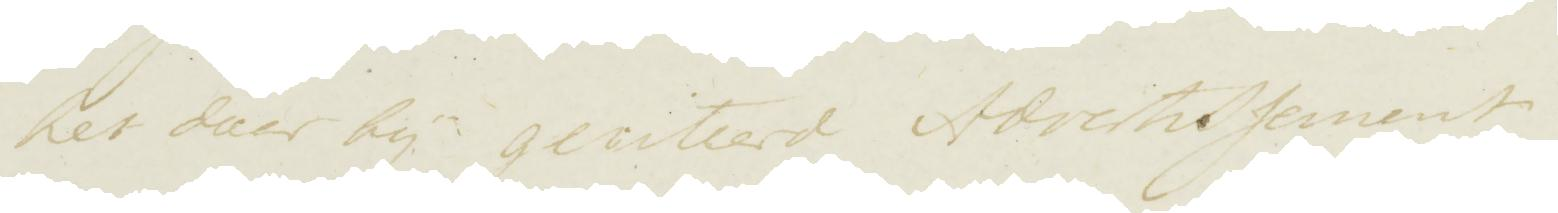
het daar bij geciteerd Advertissement
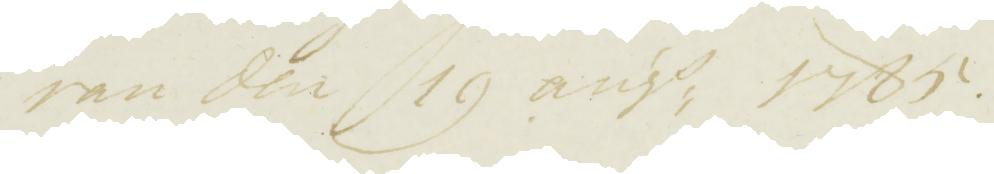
van den 19 aug„s 1785.
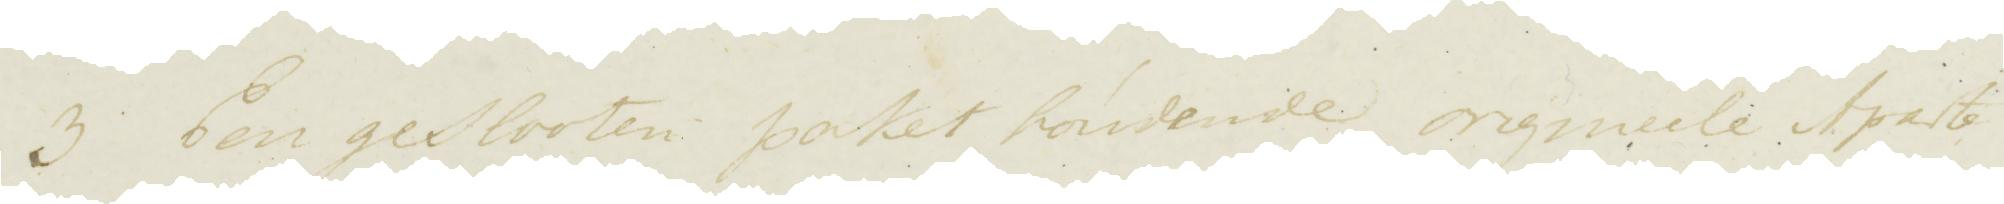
3 Een geslooten paket houdende origineele Aparte
